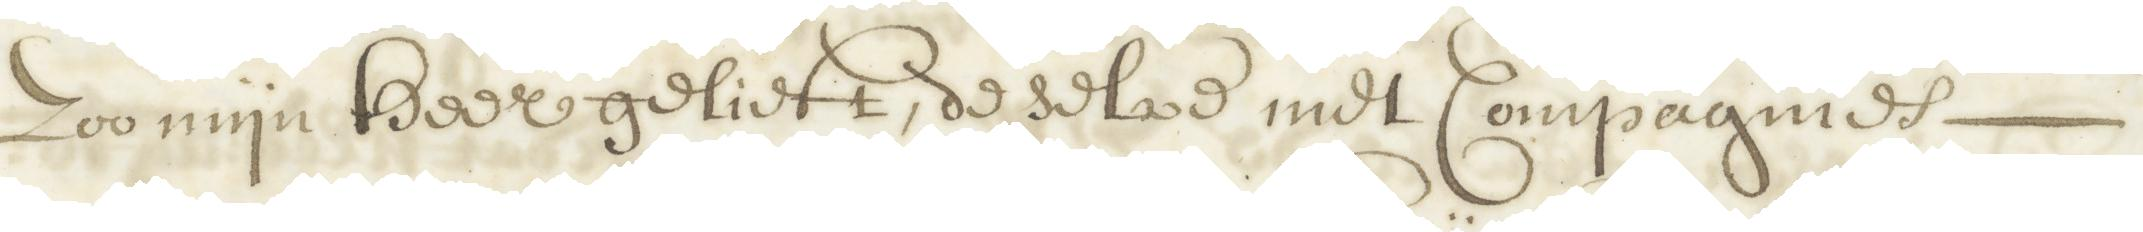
zoo mijn heer gelieft, de selve met Compagnies —
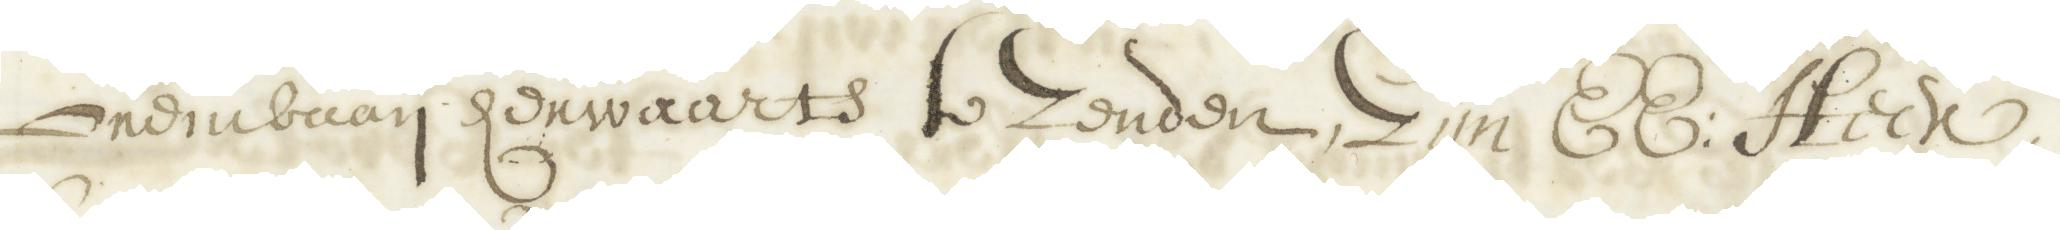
orembaaij herwaarts te zenden, zijn EE: Heer,
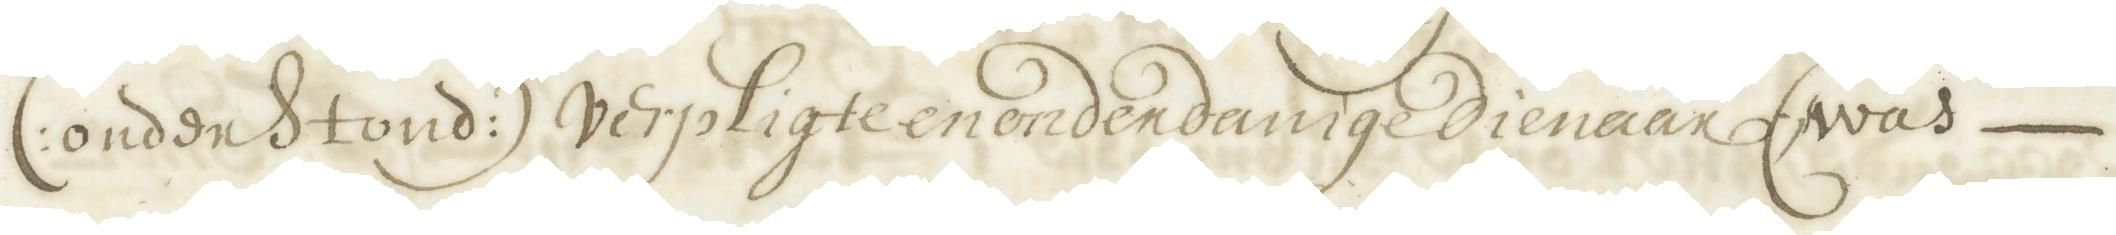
(:onderstond:) verpligte en onderdanige dienaar (:was —
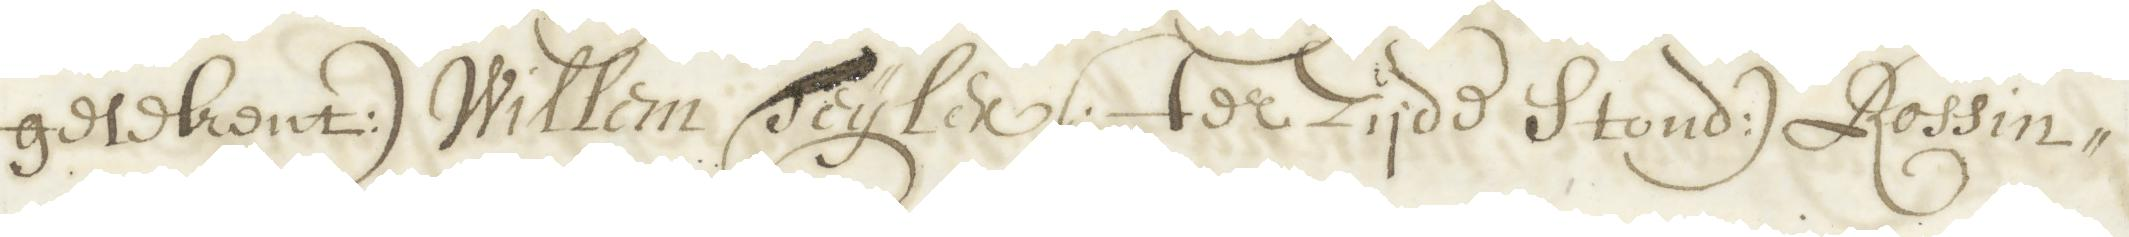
getekent:) Willem Teijler (:ter zijde stond:) Rossin„
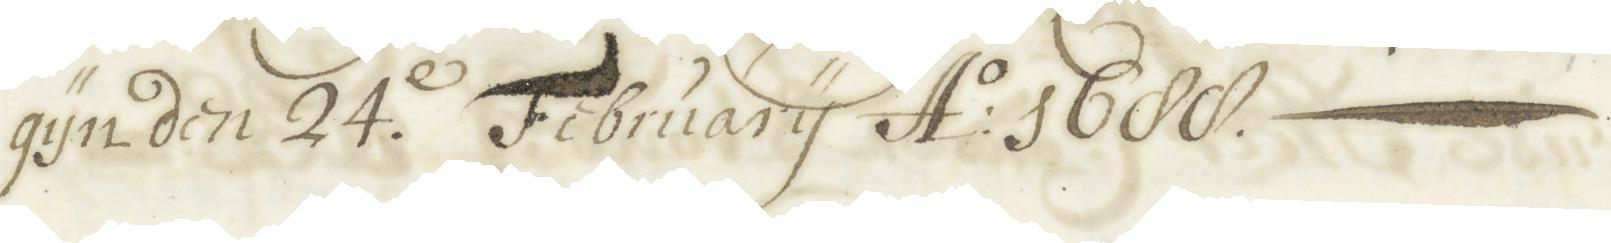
gijn den 24.e Februarij A:o 1688. —
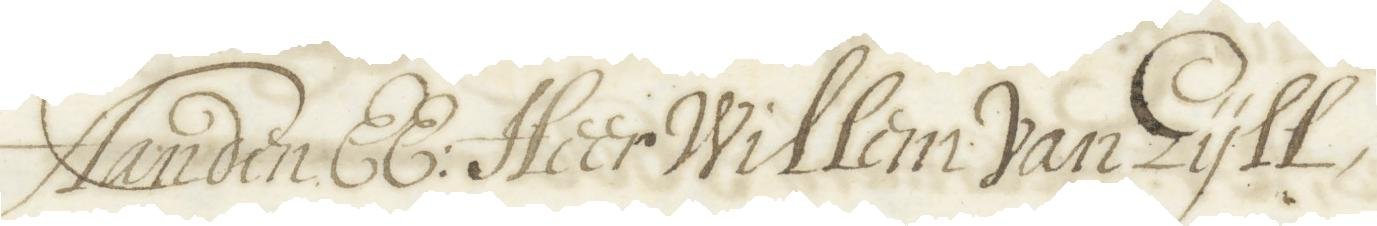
Aan den EE: Heer Willem van Zijll,
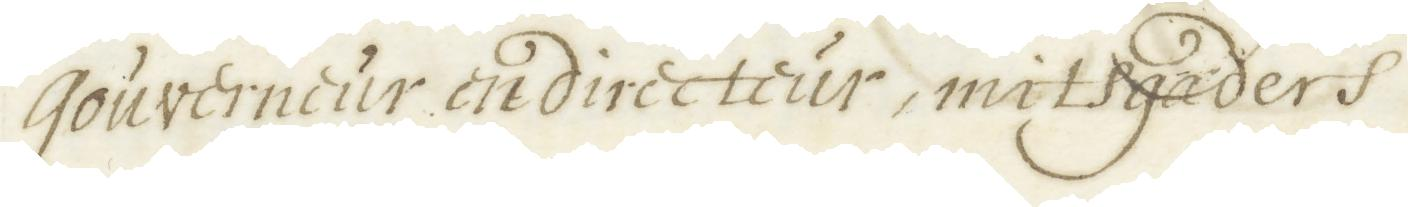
gouverneur en directeur, mitsgaders
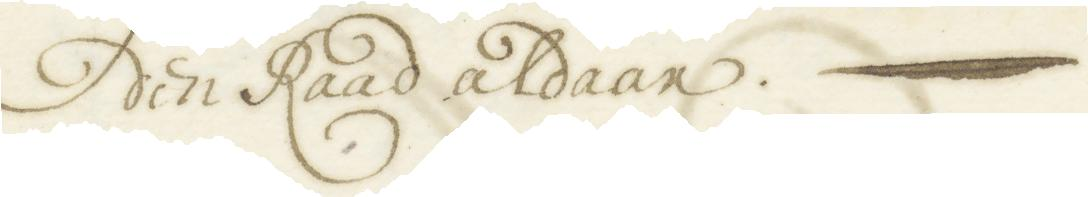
den Raad aldaar. —
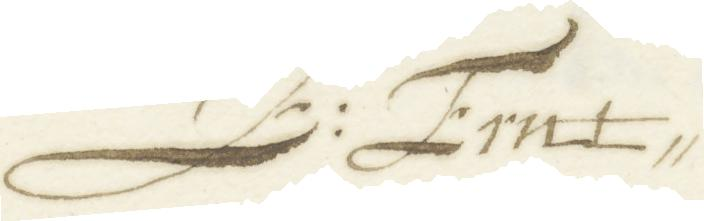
E: Ernt„
